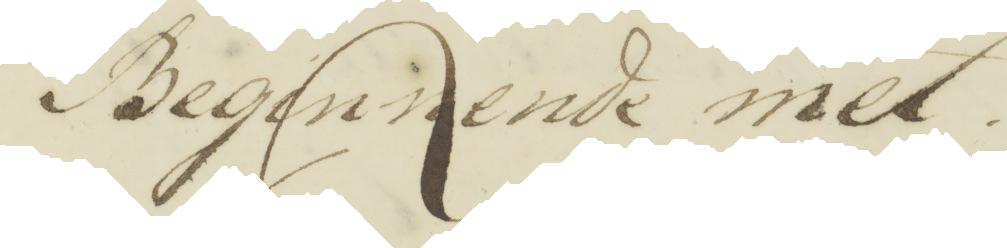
Beginnende met
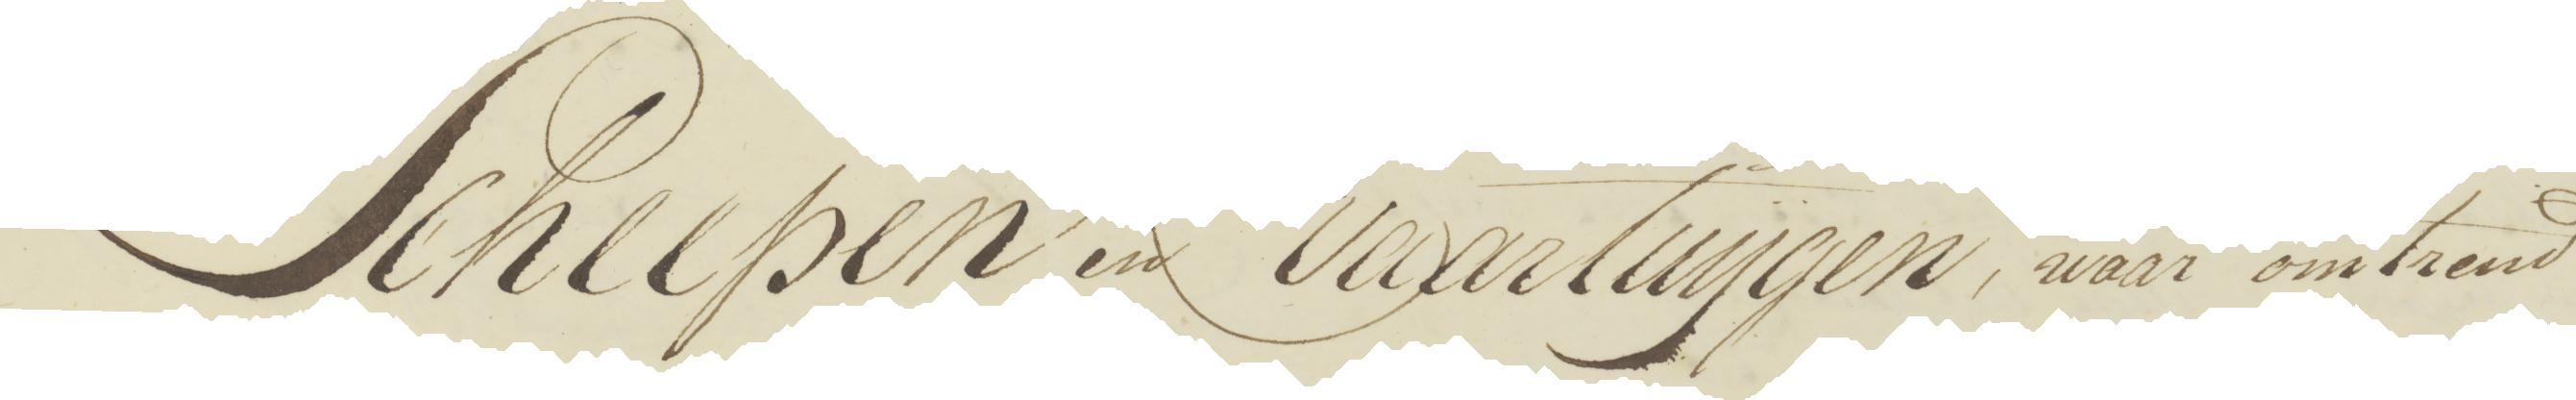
Scheepen en Vaartuijgen, waar omtrend
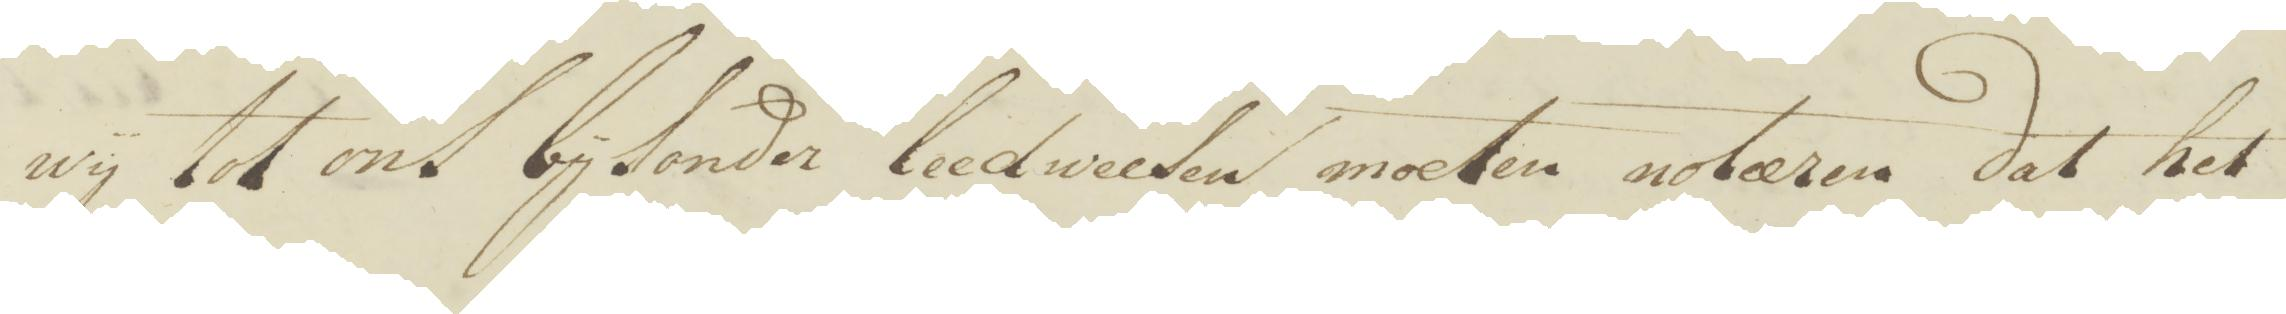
wij tot ons bijsonder leedweesen moeten noteren dat het
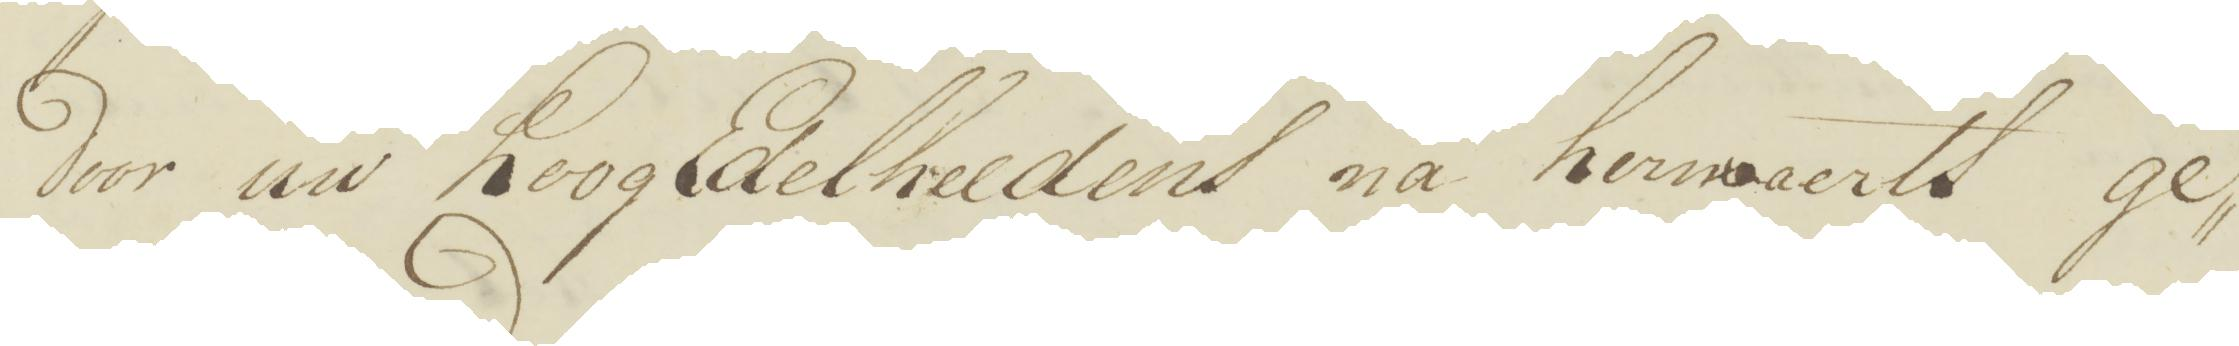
door uw hoog Edelheedens na herwaerts ge„
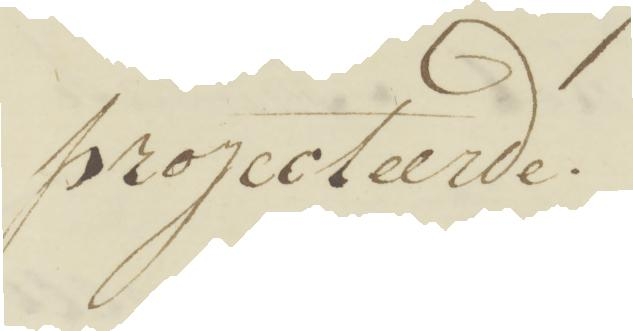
projecteerde.
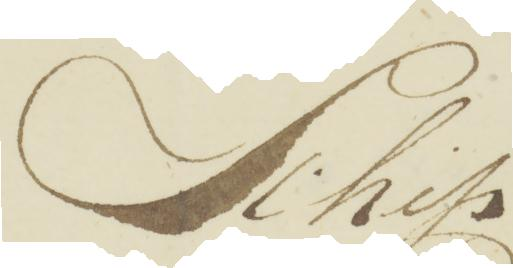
Schip
